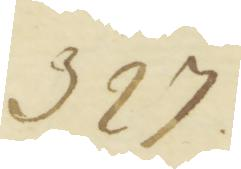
327.
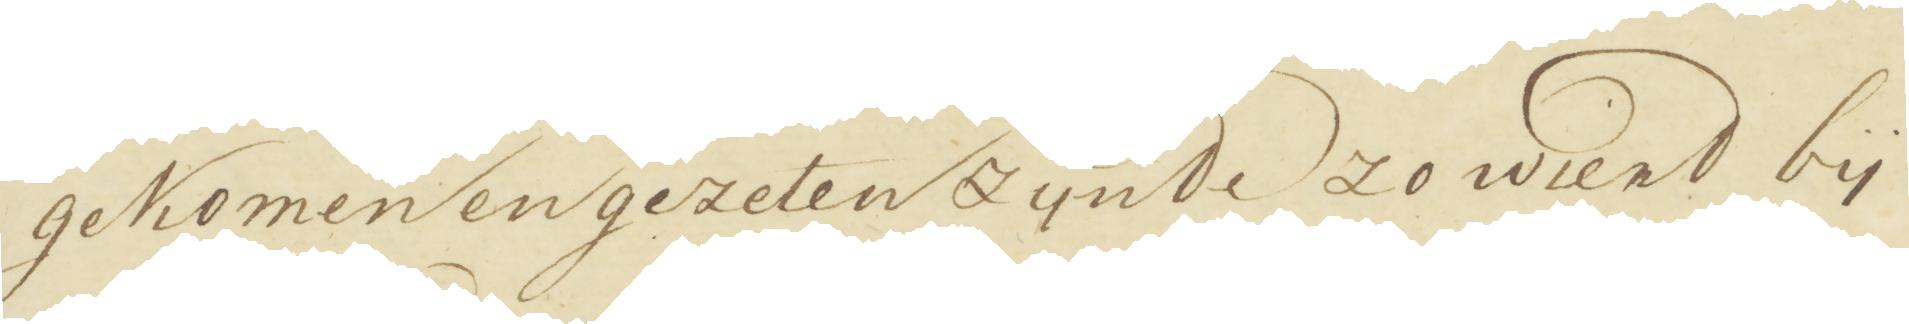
gekomen en gezeten zynde zo wierd bij
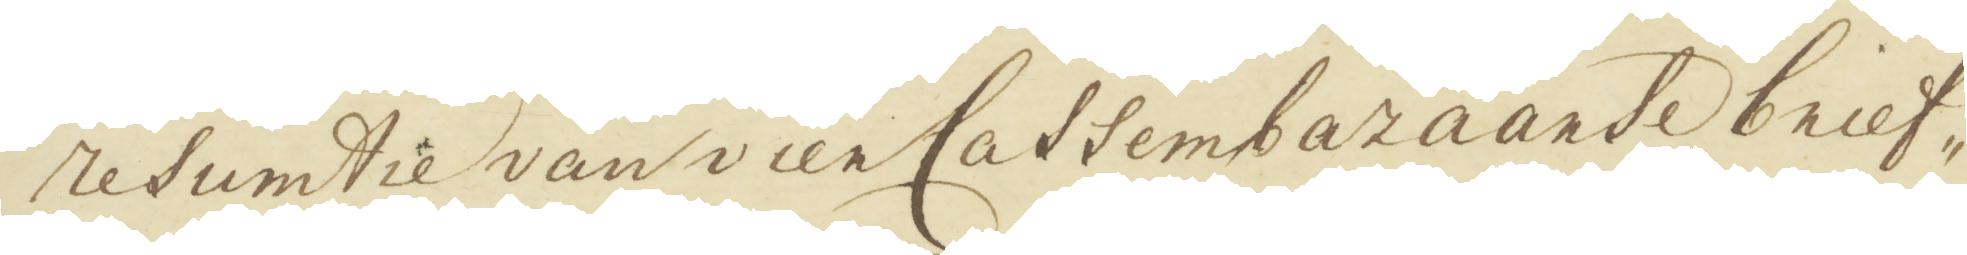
resumtie van vier Cassembazaarse brief,
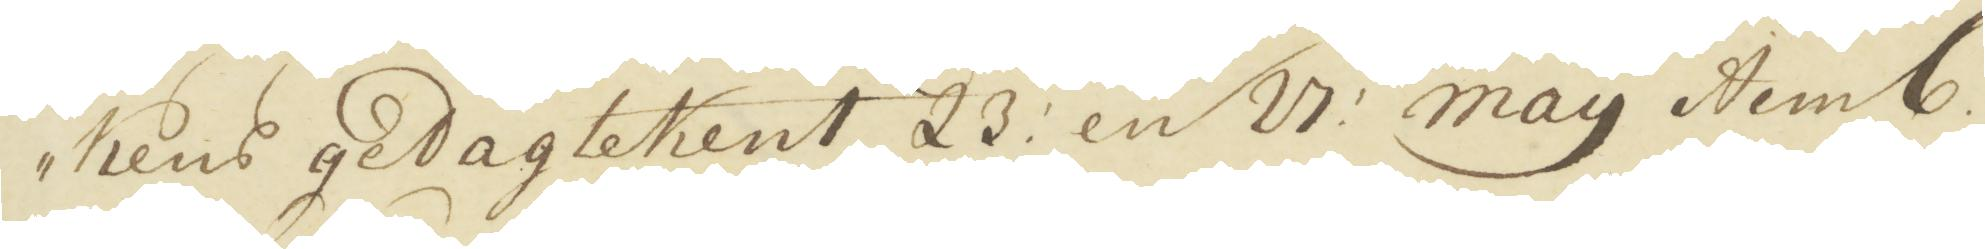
„kens gedagtekent 23:' en 27:' maij item 6.
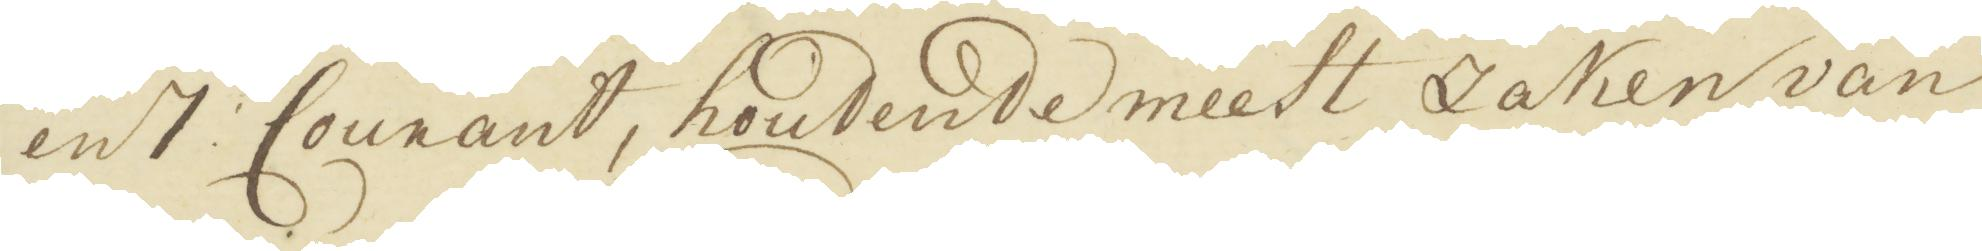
en 7:' Courant, houdende meest zaken van
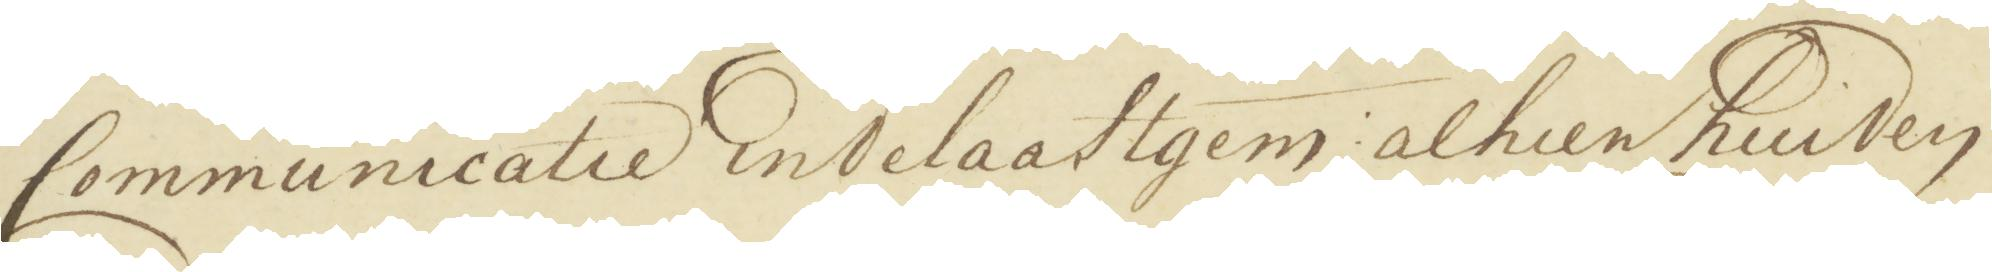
Communicatie in de laast gem: alhier huiden
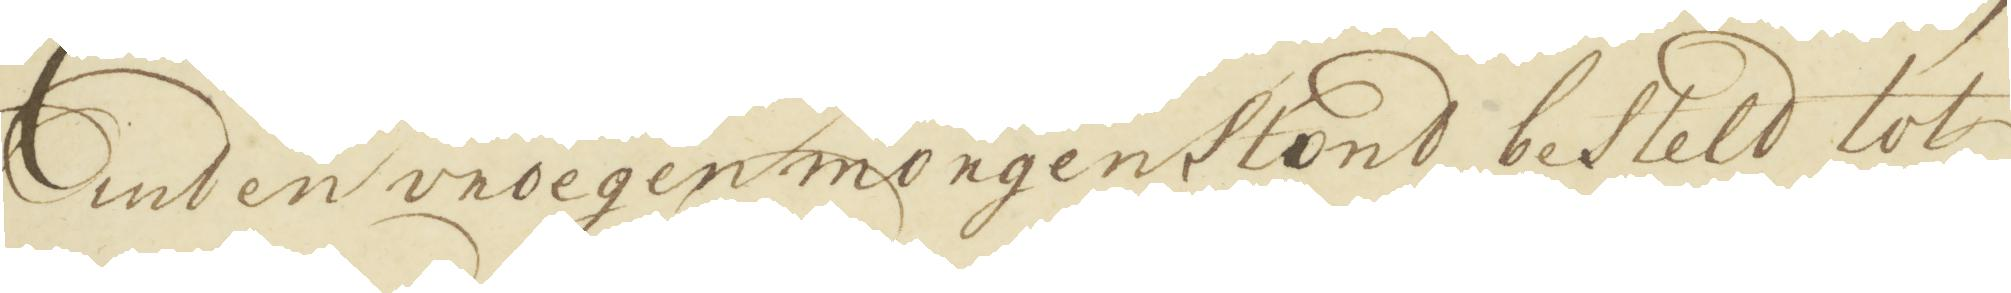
in den vroegen morgenstond besteld tot
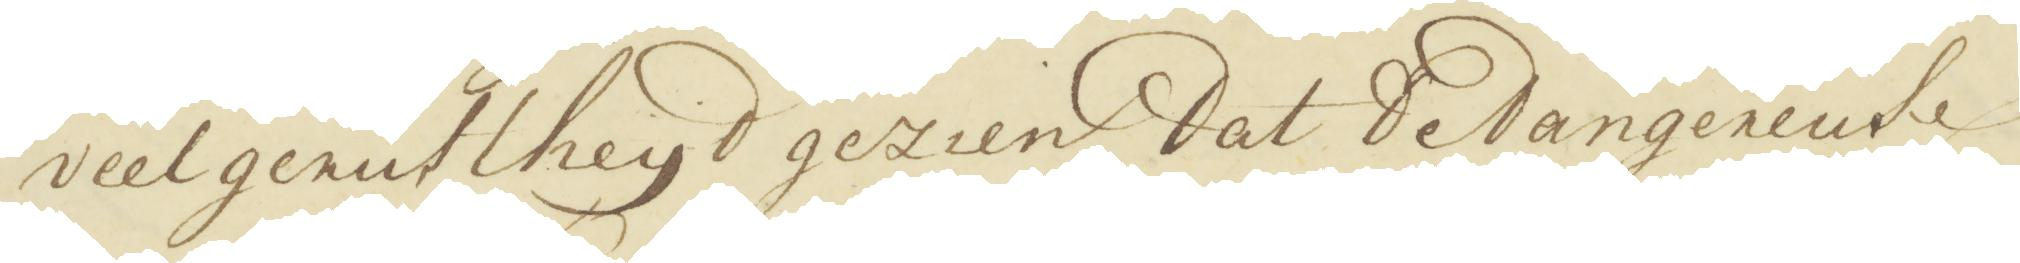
veel gerustheijd gezien dat de dangereuse
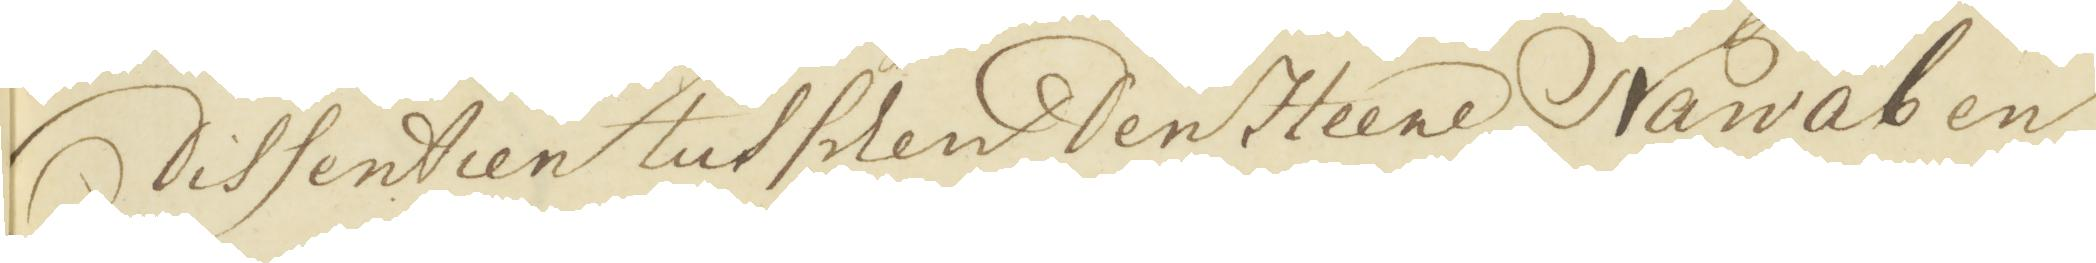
dissentien tusschen den Heere Nawab en
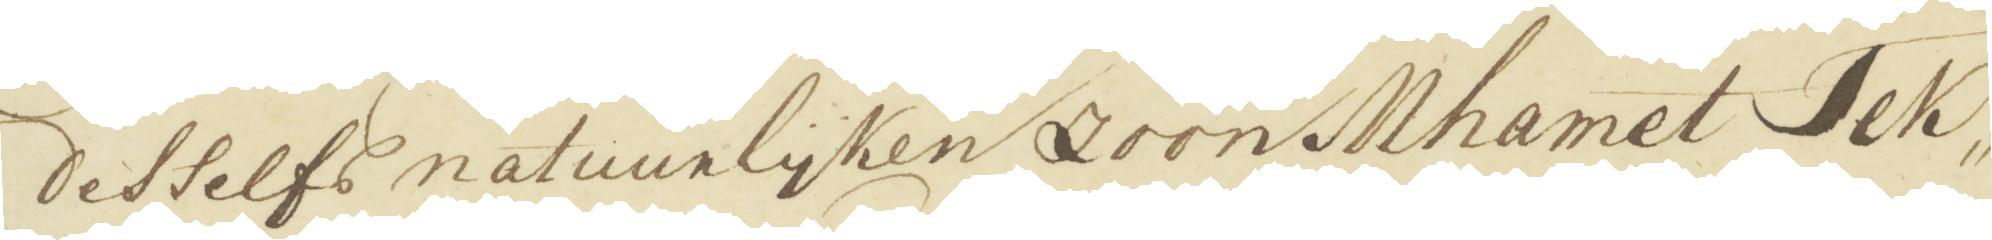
desselfs natuurlijken zoon Mhamet Tek„
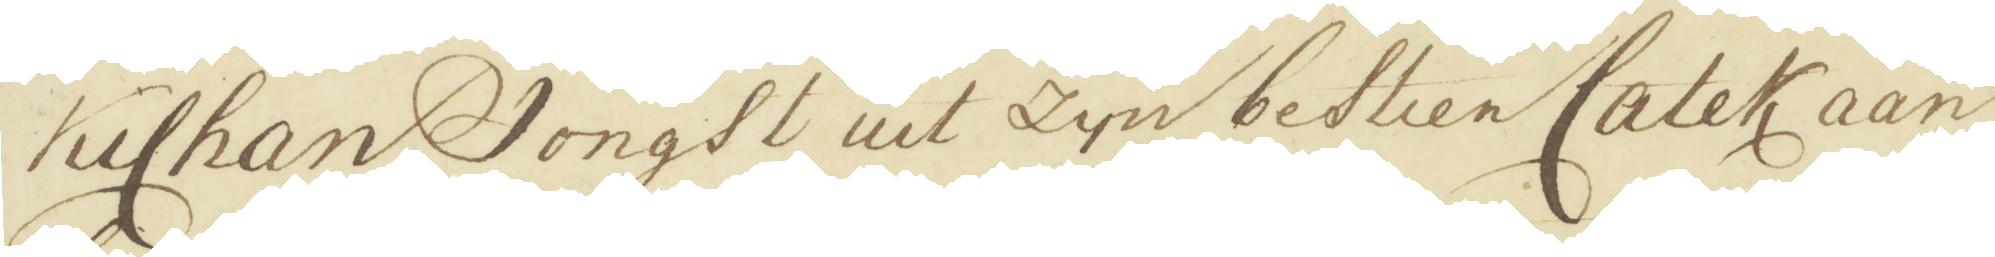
Kichan Iongst uit zijn bestier Catek aan
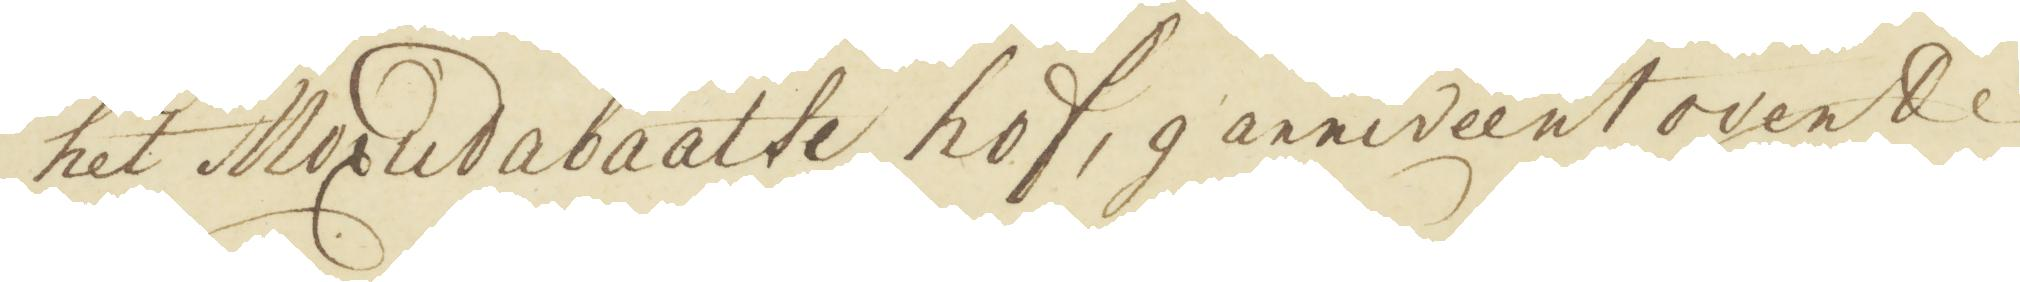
het Moxudabaatse hof, g’arriveert over de
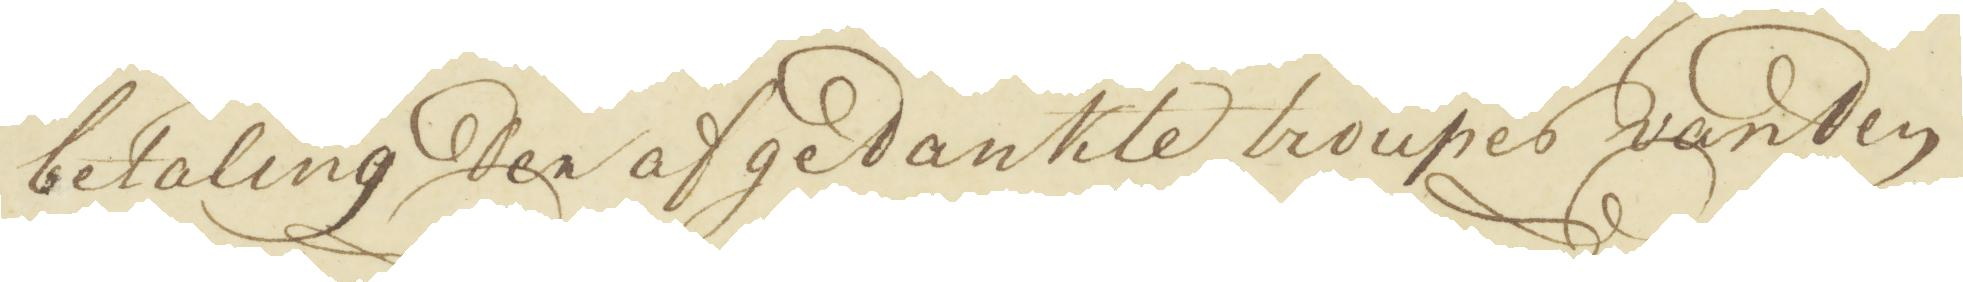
betaling der afgedankte troupes van den
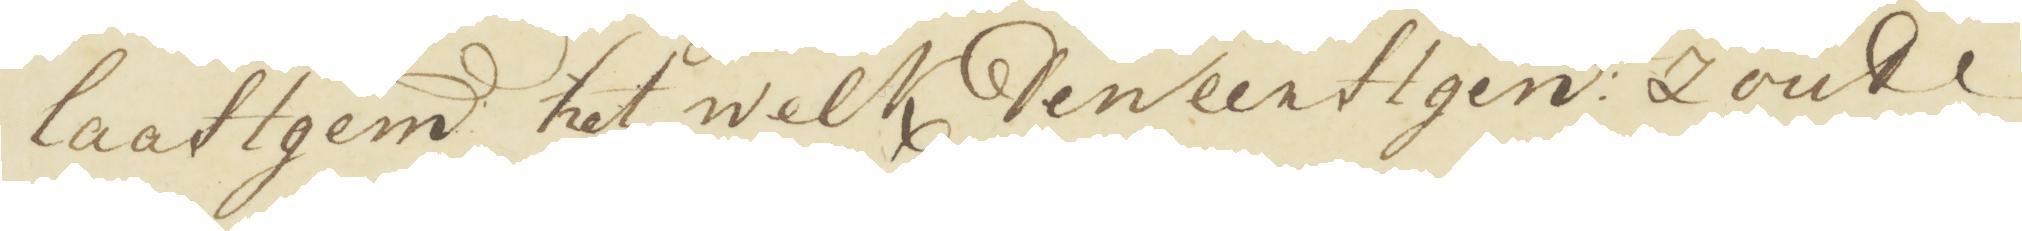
laastgem: het welk den eerst gen:e zoude
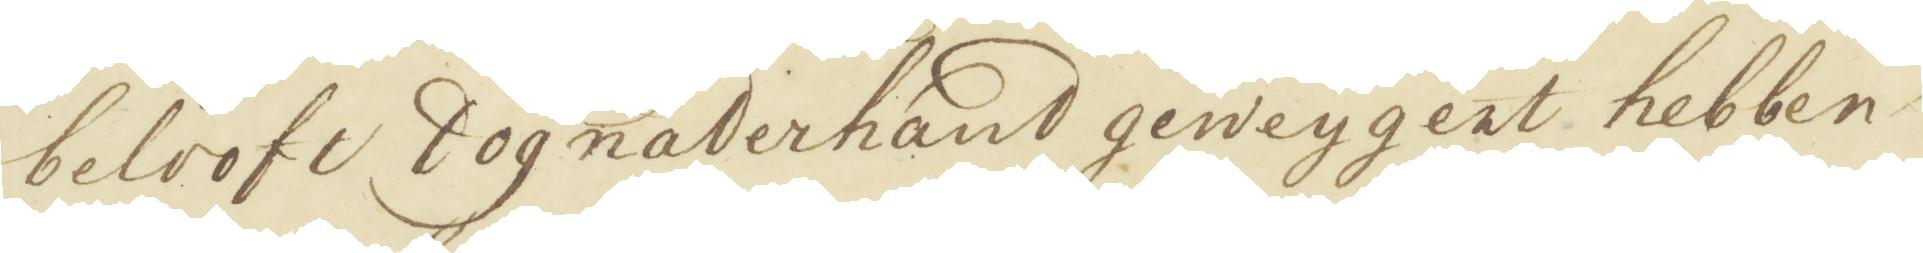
belooft dog naderhand geweijgert hebben
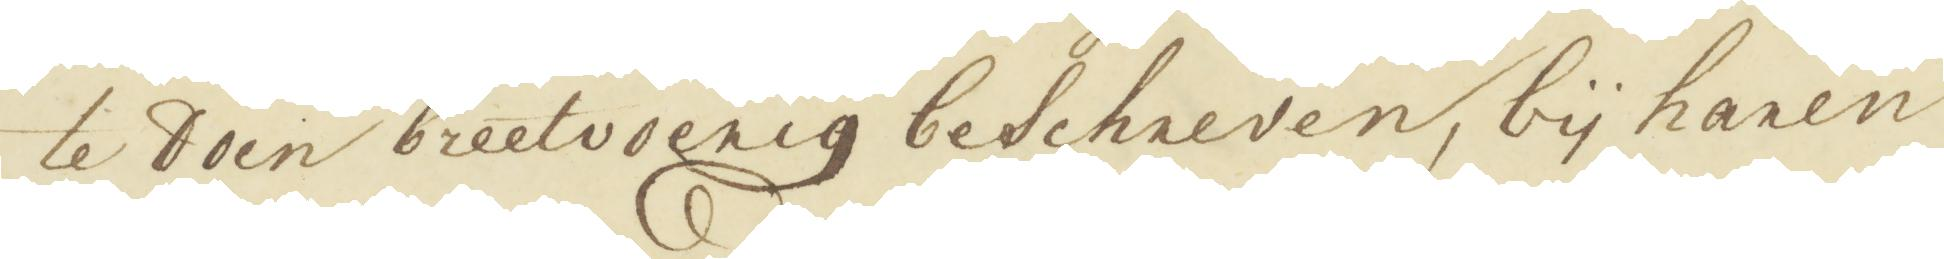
te doen breetvoerig beschreven, bij haren
